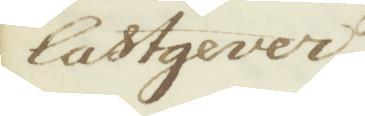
lastgever
